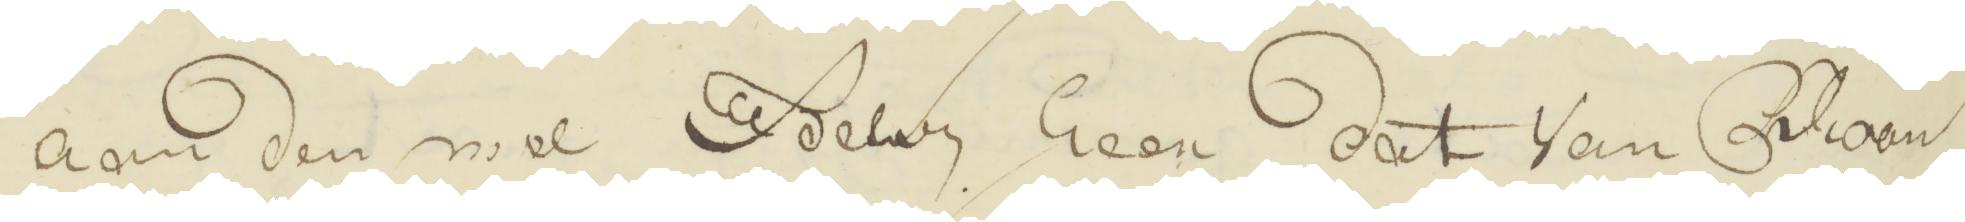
aan den wel Edelen heer dat van Schoon
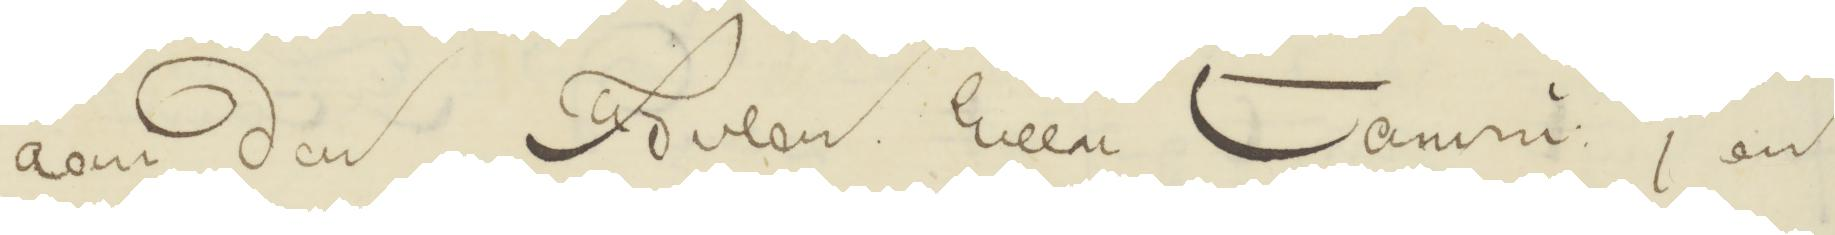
aan den Edelen heer Comm:s, en
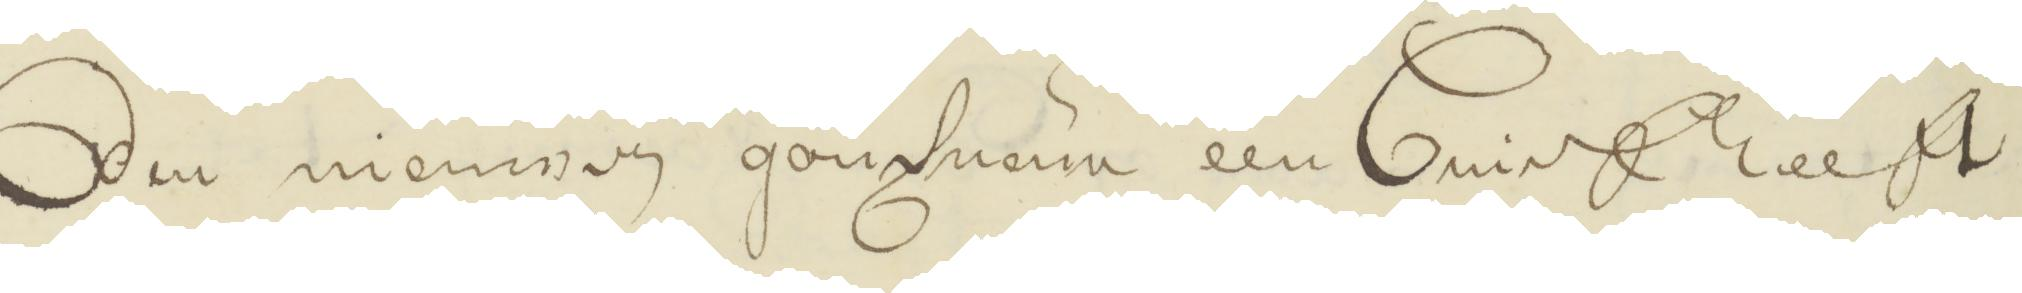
den nieuwen gouverneur een brief heeft
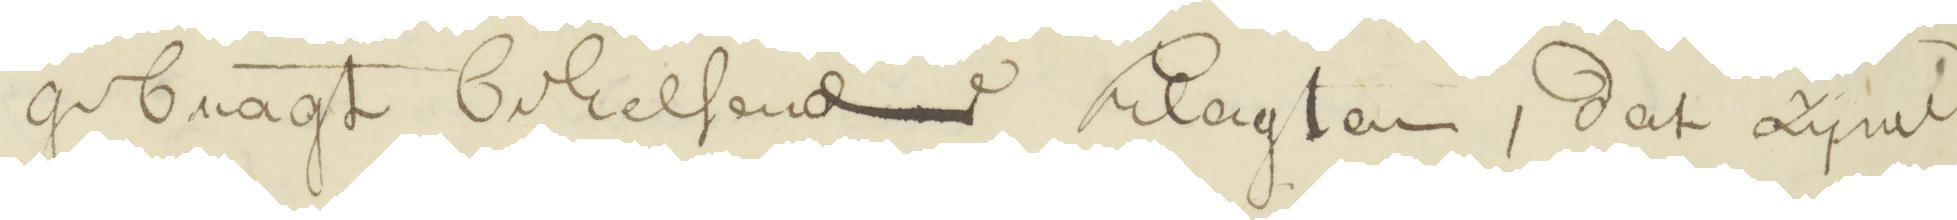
gebragt behelsende klagten, dat zijne
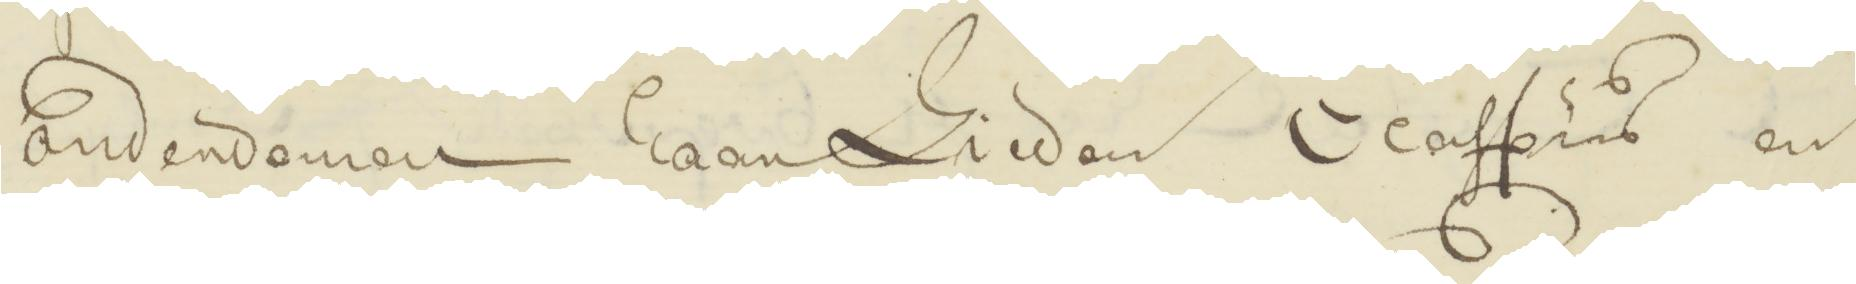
onderdanen haar Zieden Clappus en
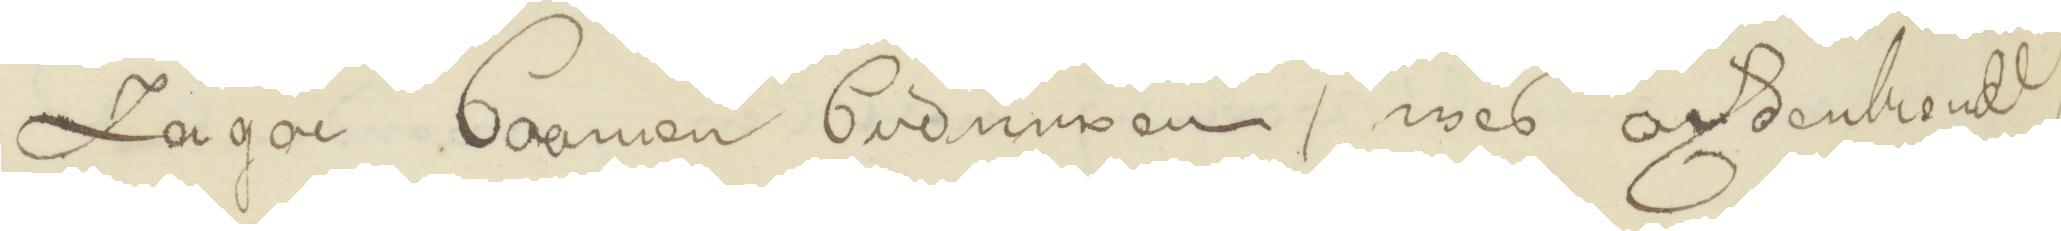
zagoe boomen bedurven / wes overdenkende,
